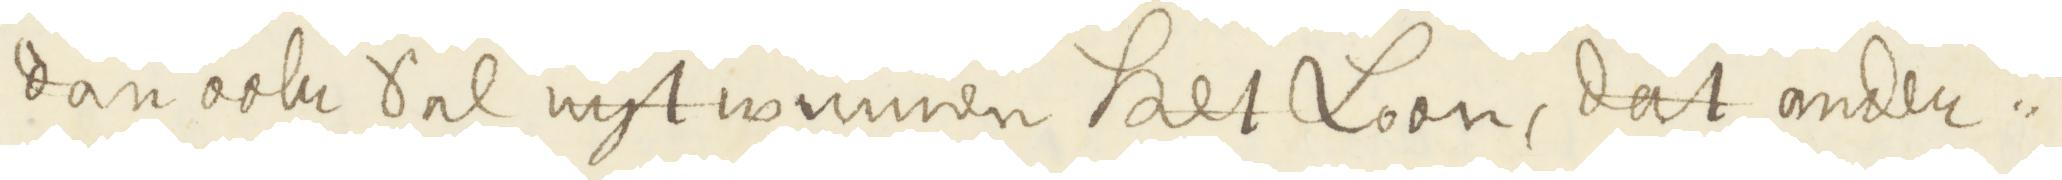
dan ook sal uijt winnen het Loon, dat ander„
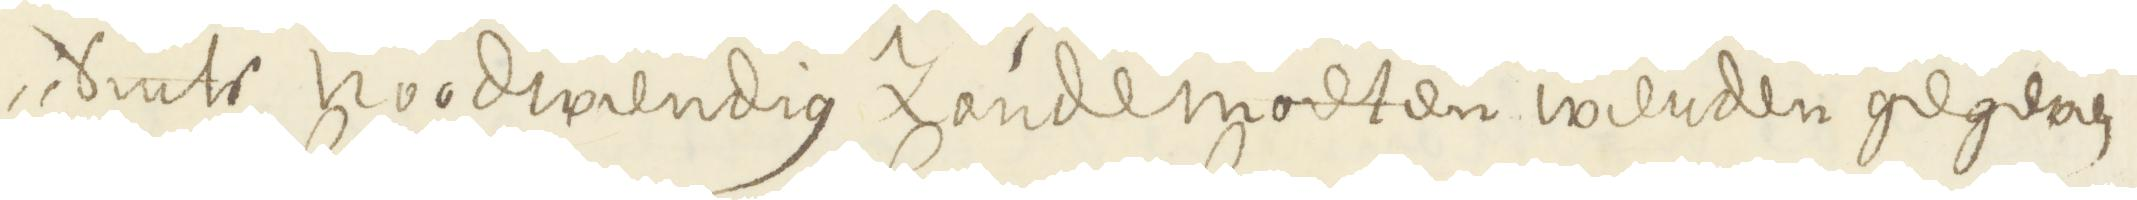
„sints noodwendig zoude moeten werden gegeven
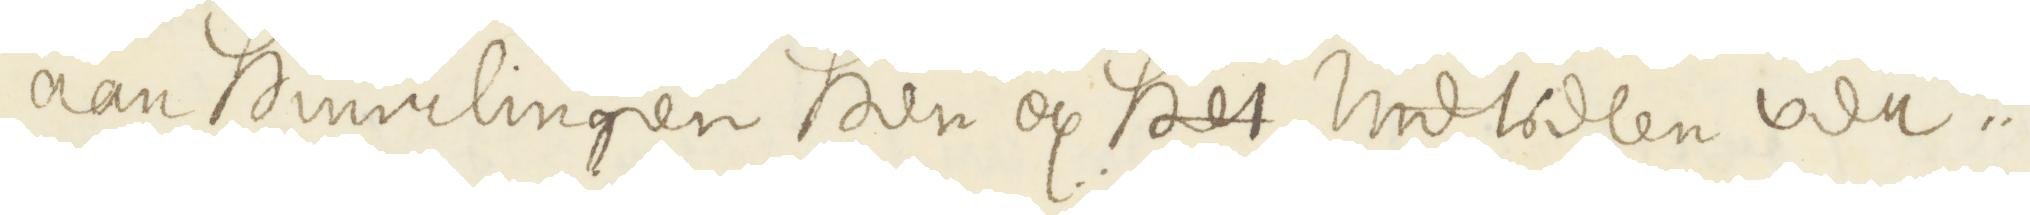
aan huurlingen hen op het metselen ver„
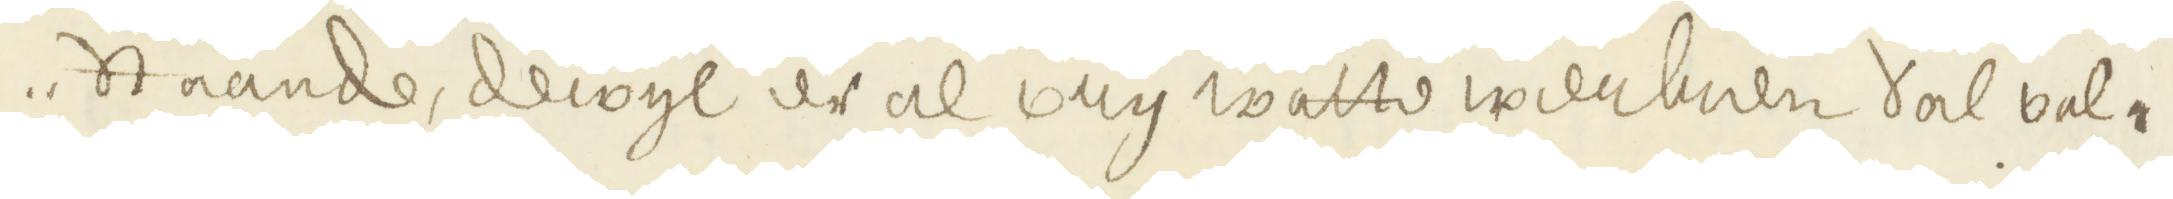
„staande, dewijl' er al vrij watte werken sal val„
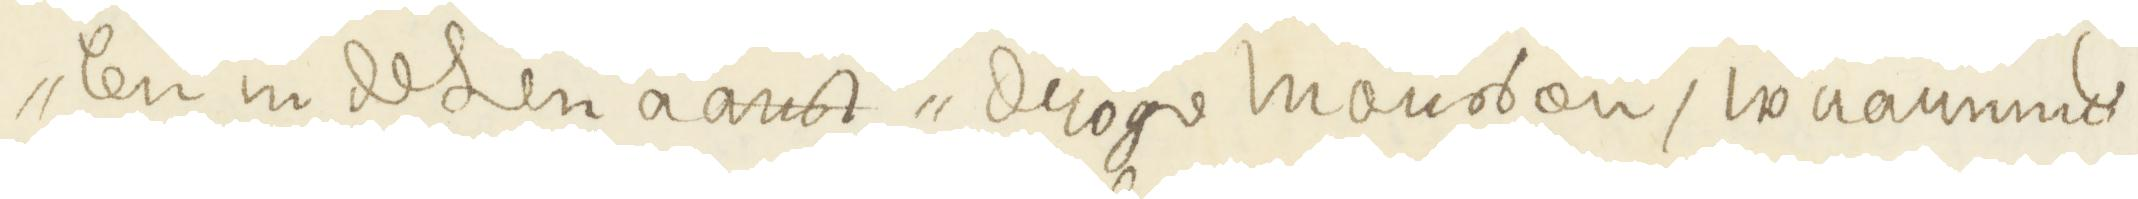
„len in desen aanst„e droge mousson, waarinne
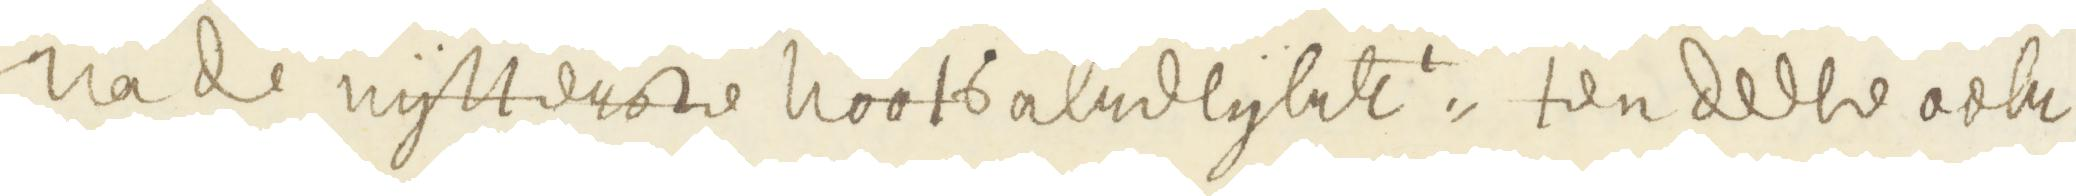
na de uijtterste nootsakelijkh„t ten deele ook
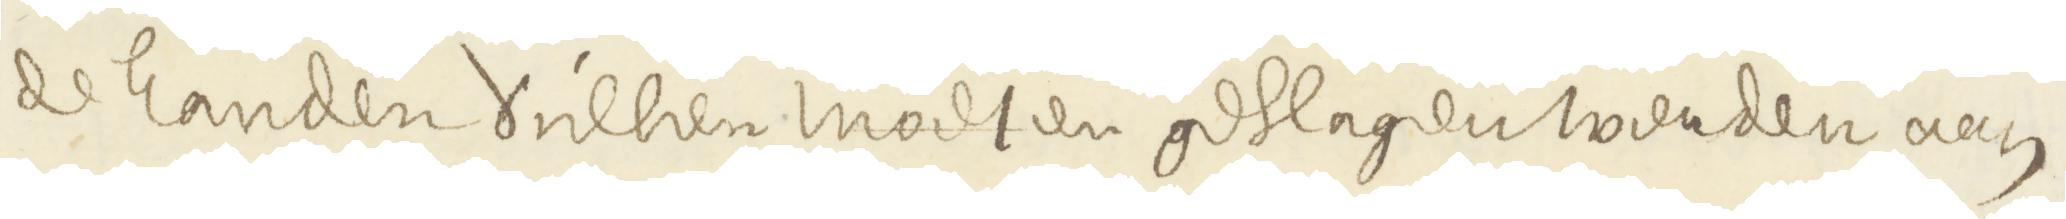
de handen sullen moeten geslagen werden aan
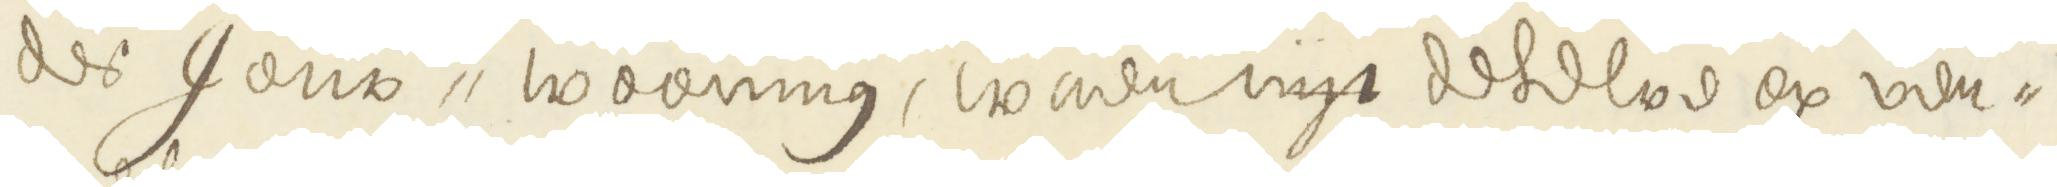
des gouv„rs wooning, waeruijt deselve op ver„
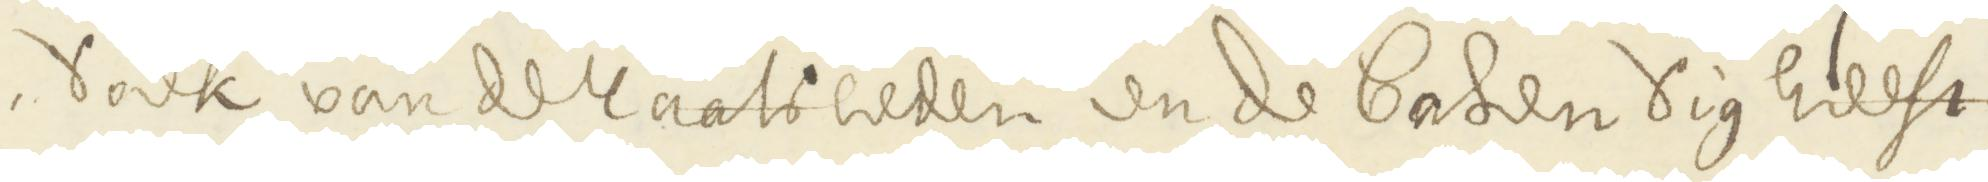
„soek van de raatsleden en de basen sig heeft
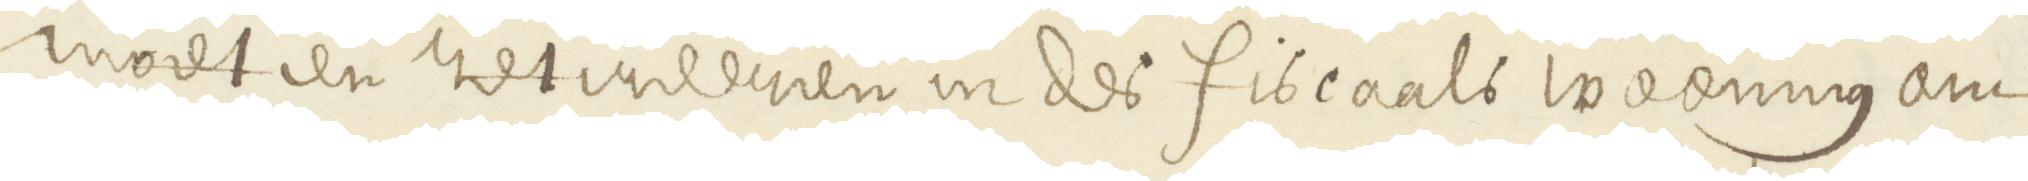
moeten retireeren in des fiscaals wooning om
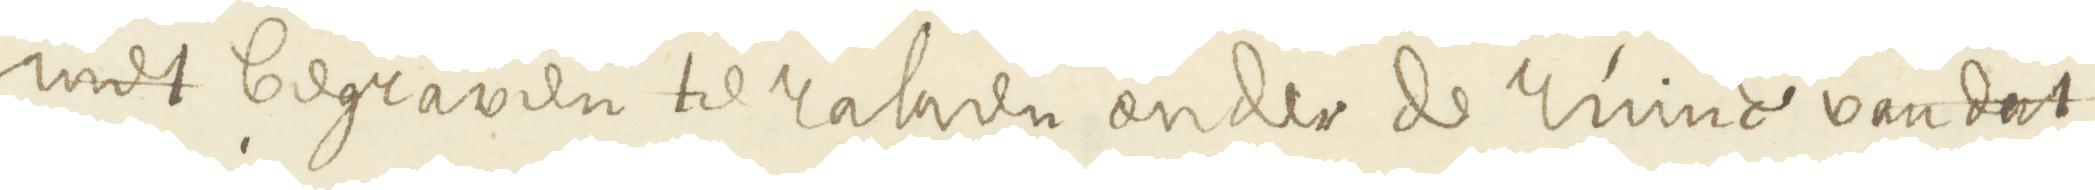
niet begraven te raken onder de ruine van dat
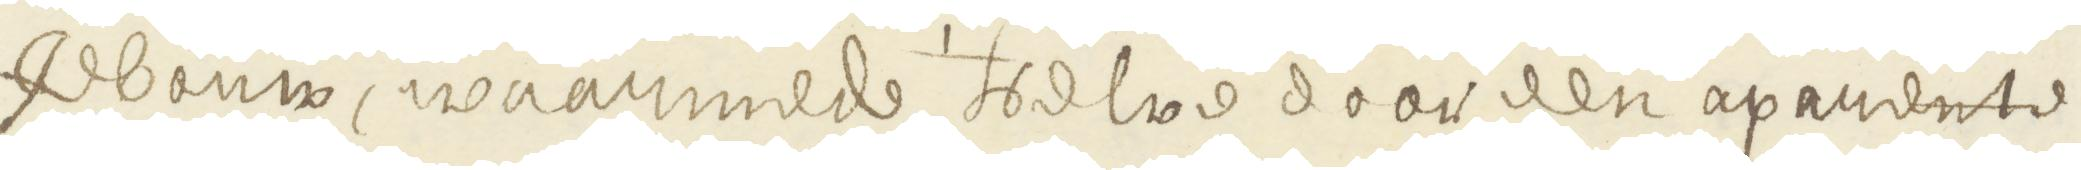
gebouw, waarmede 'tselve door een aparente
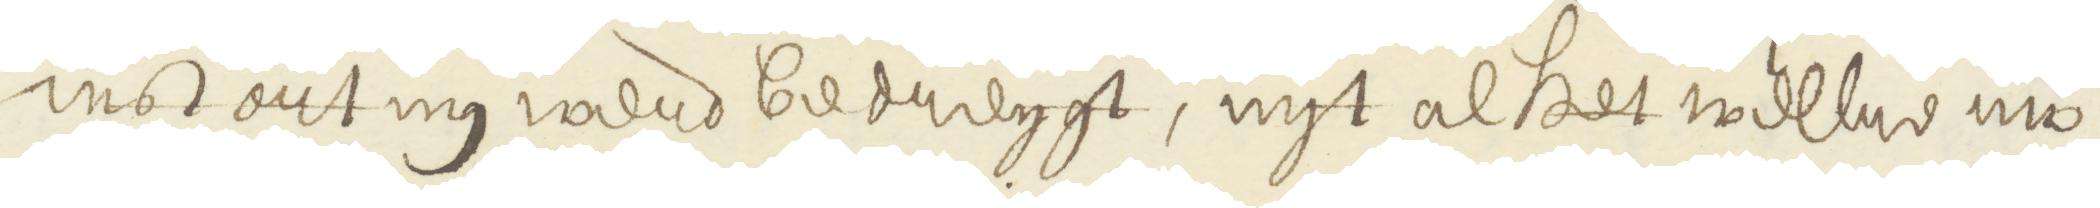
instorting werd bedreijgt, uijt al het welke uw
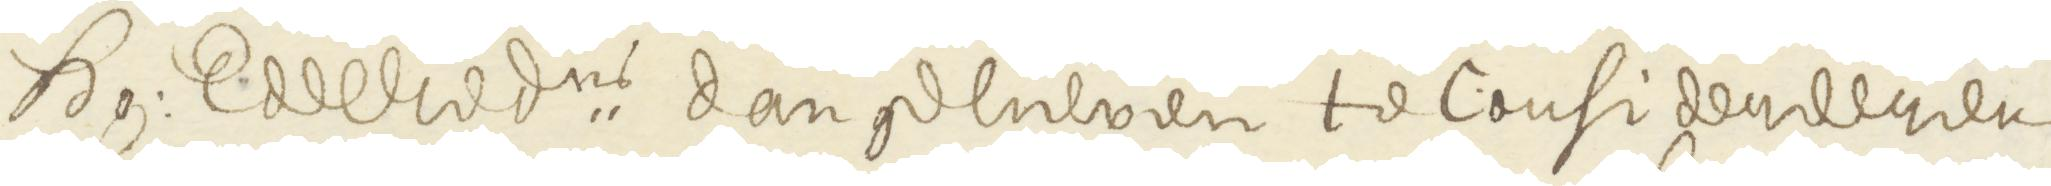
ho: Edelhed„ns dan gelieven te Considereeren
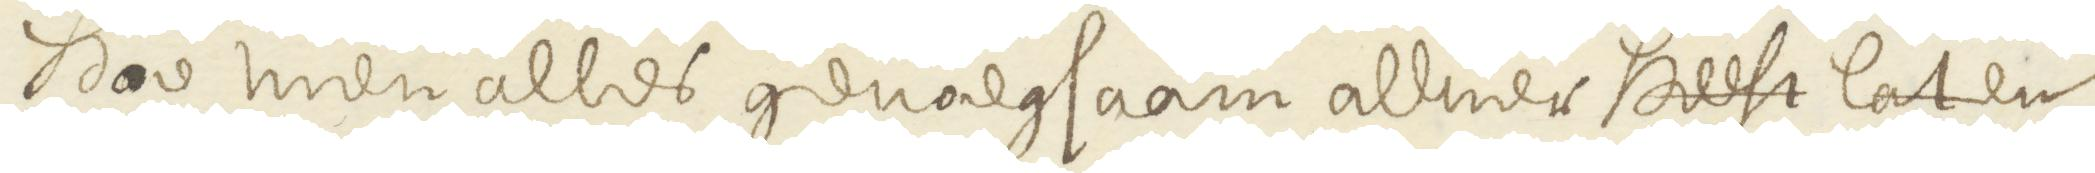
hoe men alles genoegsaam alhier heeft laten
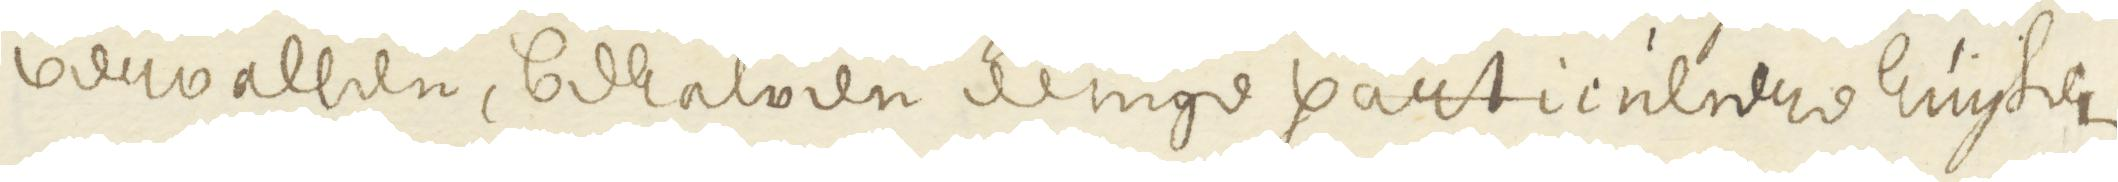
vervallen, behalven eenige particuliere huijsen
